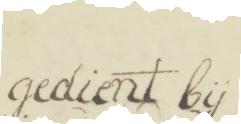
gedient bij
